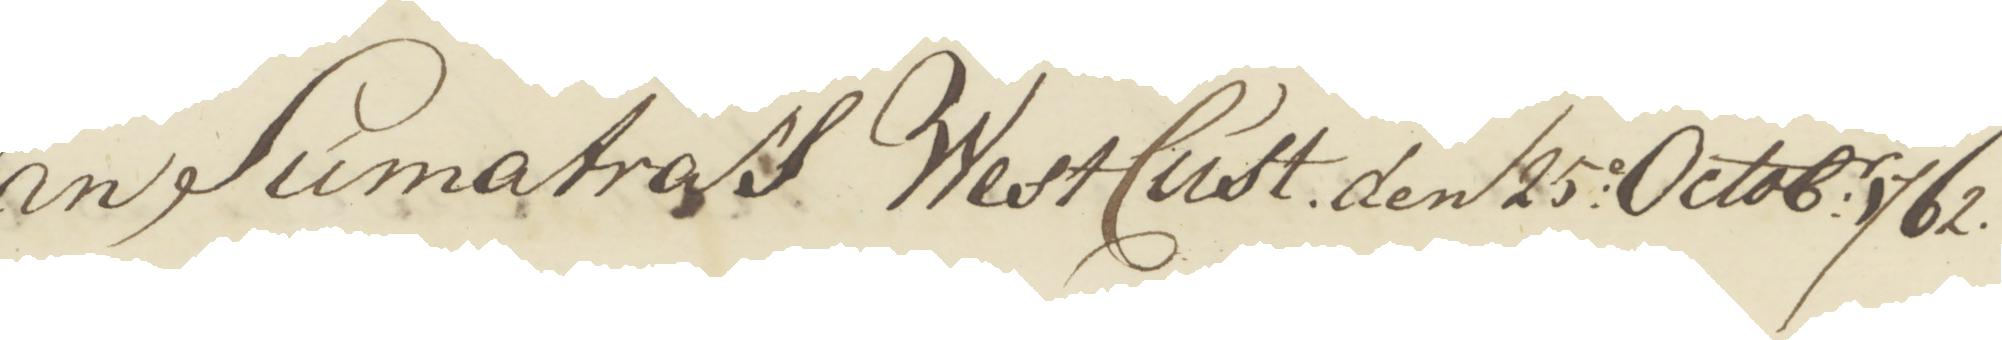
Van Sumatras West Cust den 25: Octob:r 1762.
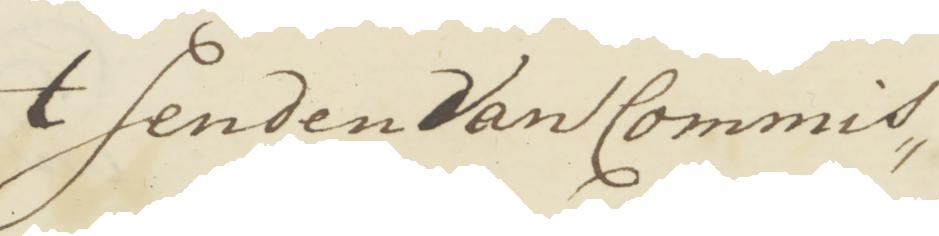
t senden van Commis„
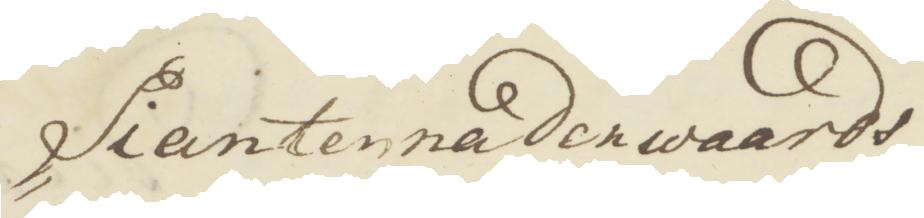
„siantenna derwaards,
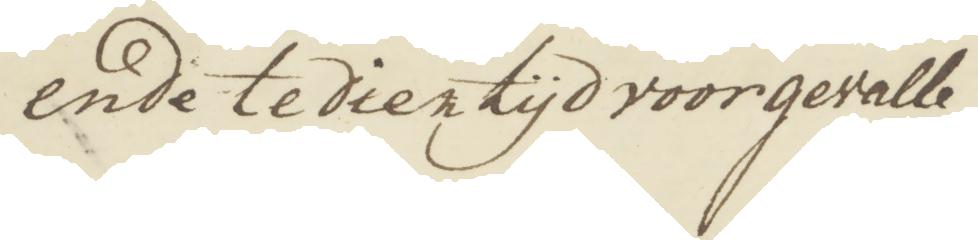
ende te dier tijd voor gevalle
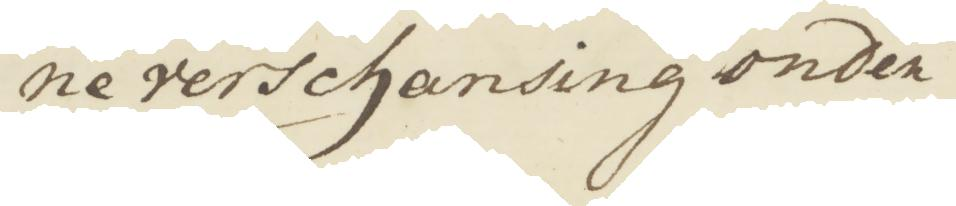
ne verschansing onder
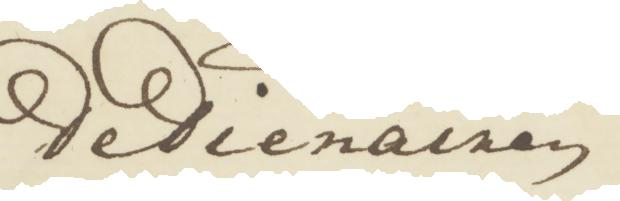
de dienairen
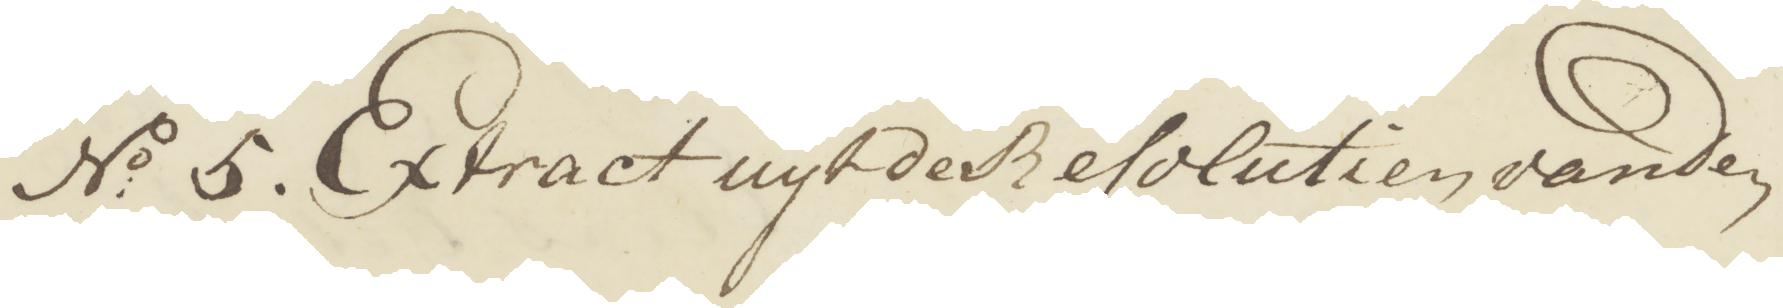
N:o 5. Extract uyt de Resolutien van den
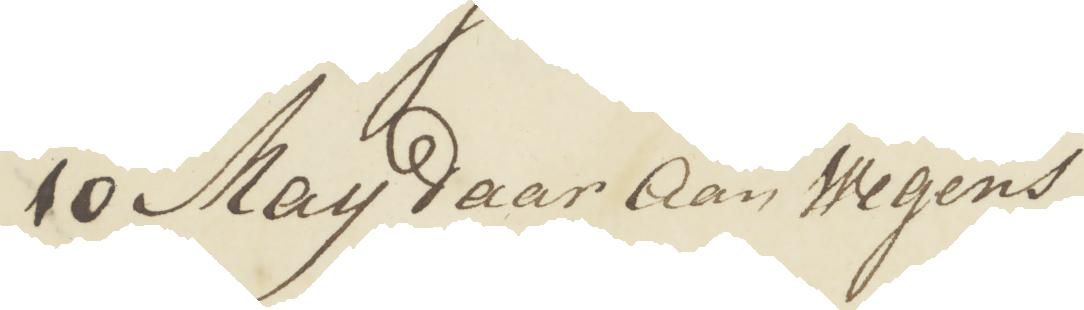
10 May daar aan wegens
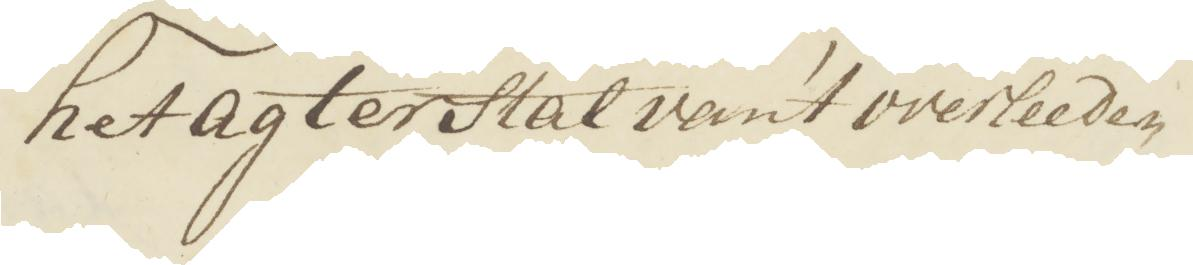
het agterstal van ’t overleeden
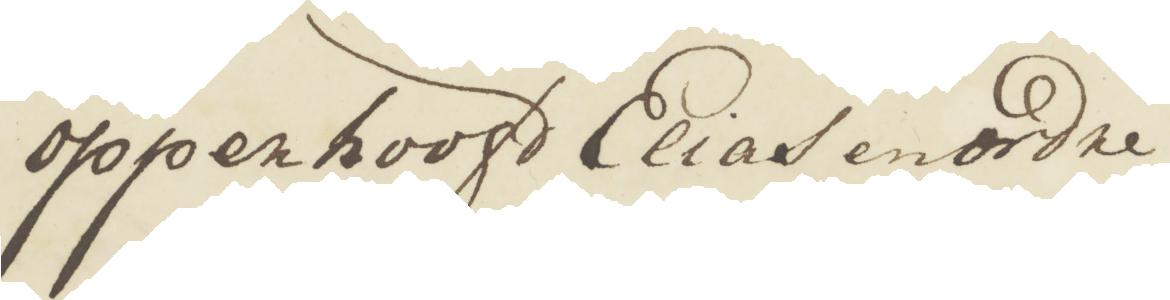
opperhoofd Elias en ordre
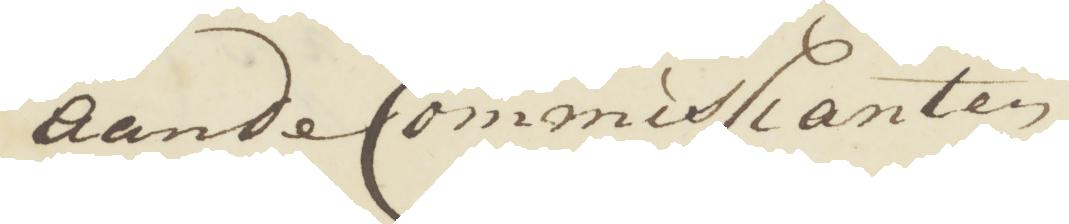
aande Commissianten,
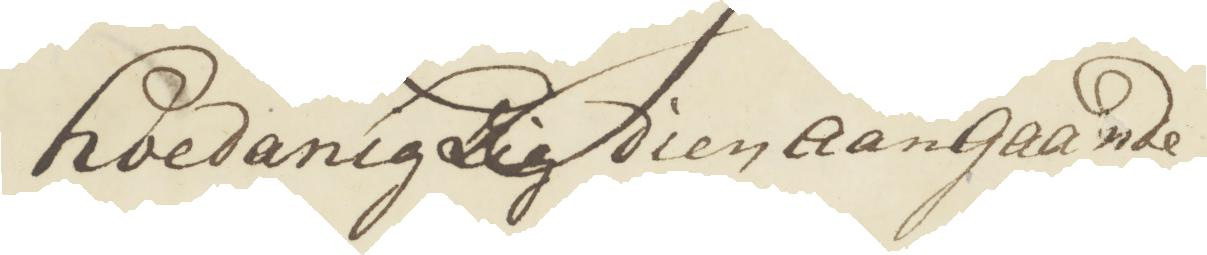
hoedanig zig dien aangaande
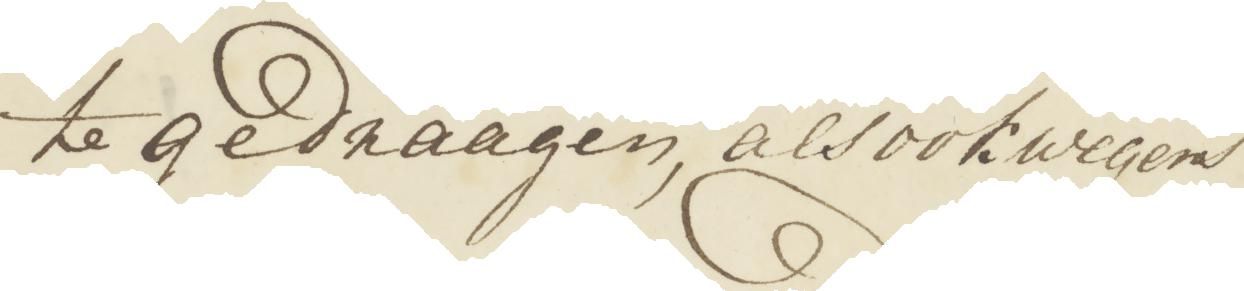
te gedraagen, als ook wegens
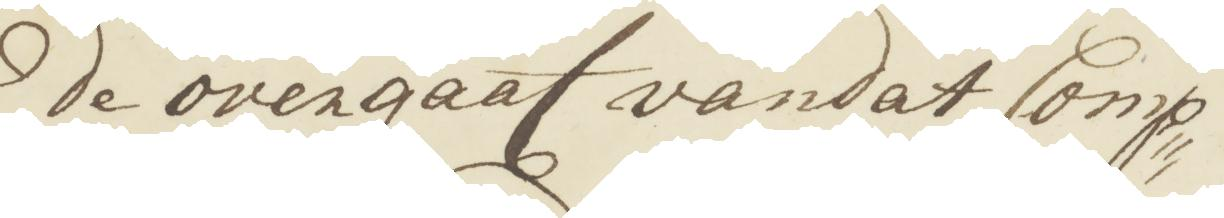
de overgaaf vandat Comp„
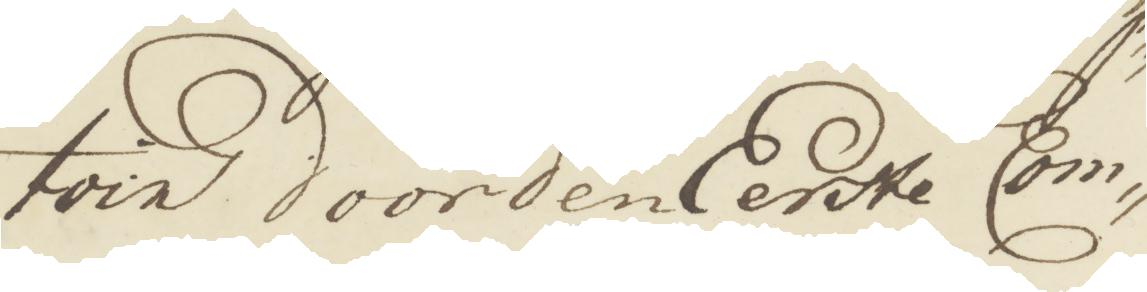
toir door den Eerste Com„
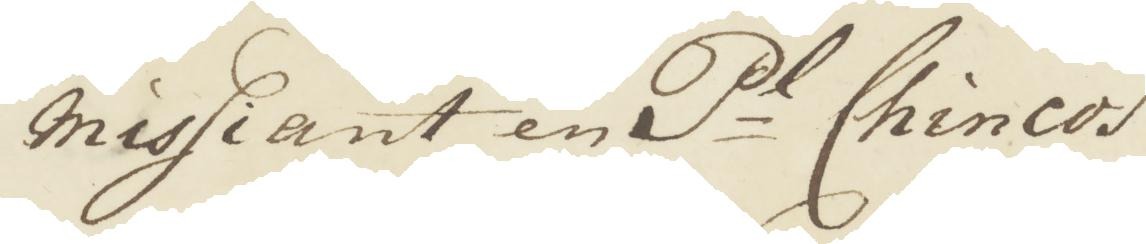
missiant en P=l Chincos
